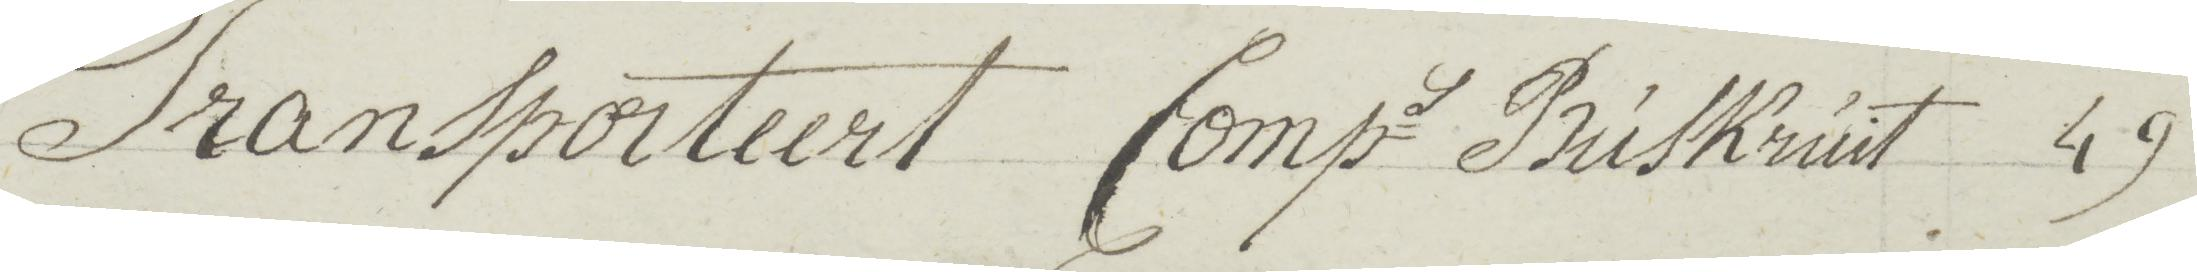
Transporteert Comp=s Buskruit 49
